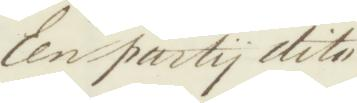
Een partij dito
